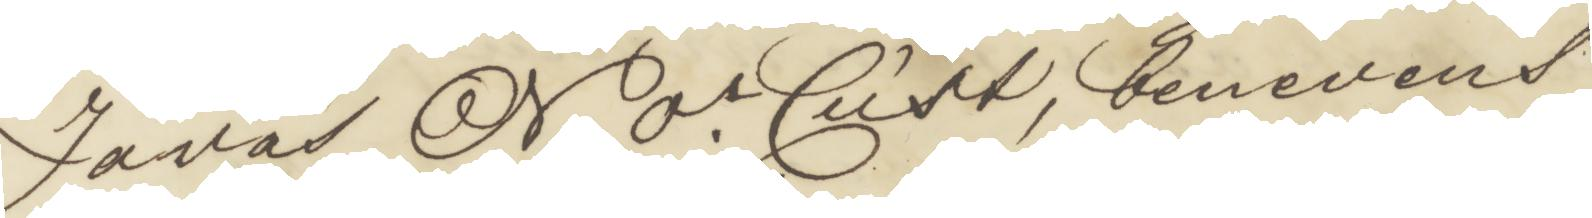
Javas N. o.t Cust, benevens
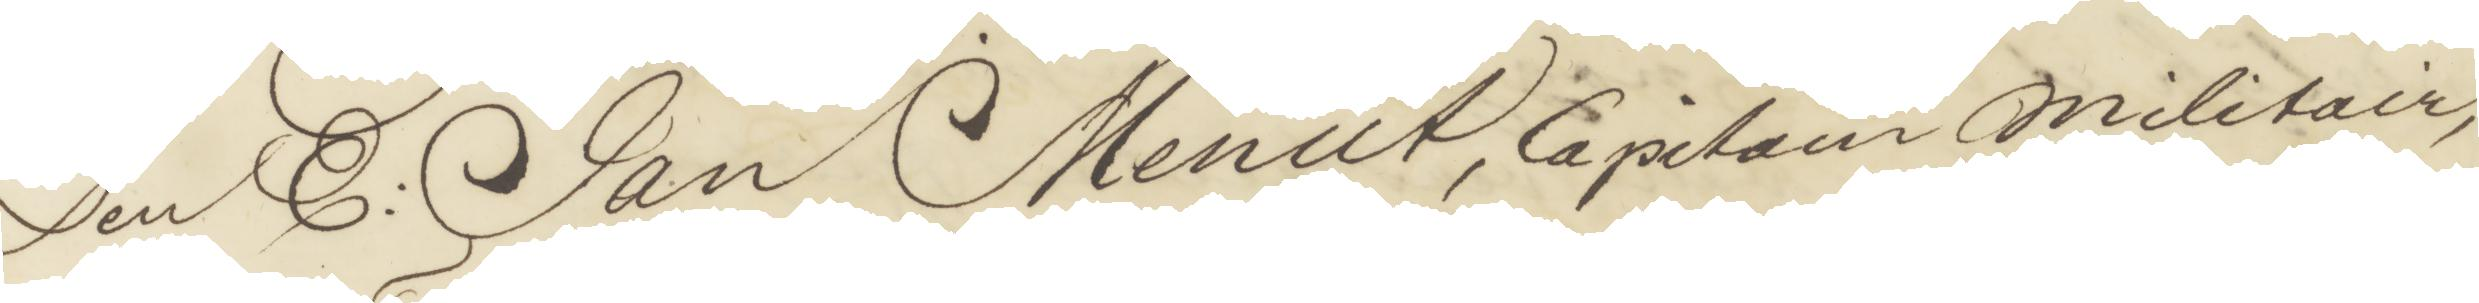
Den E: Jan Menut, Capitain militair,
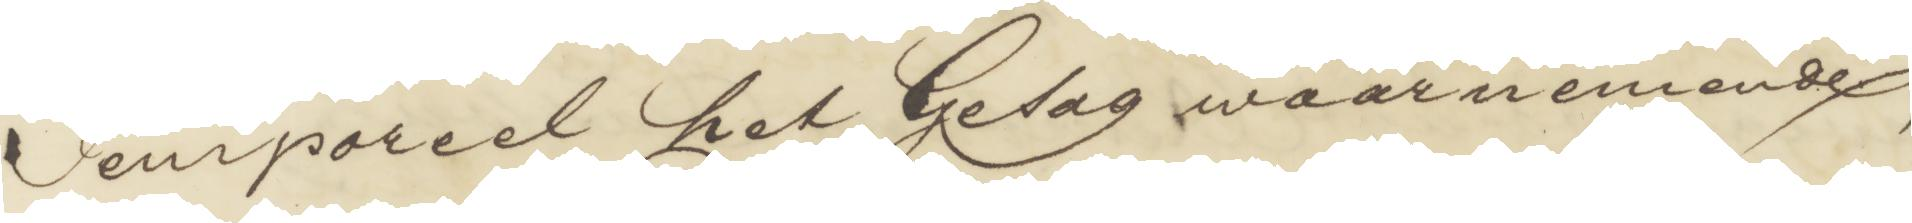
Temporeel het Gesag waarnemende
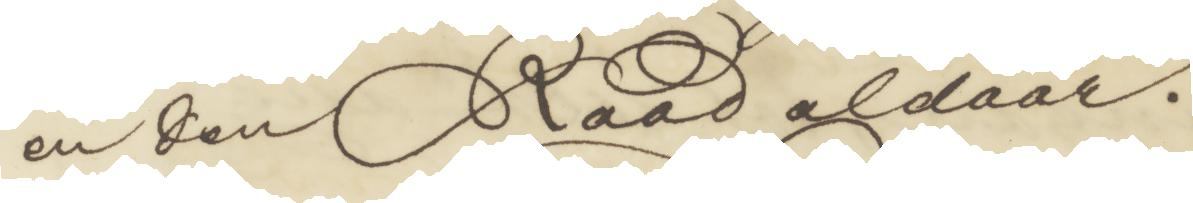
en den Raad aldaar.
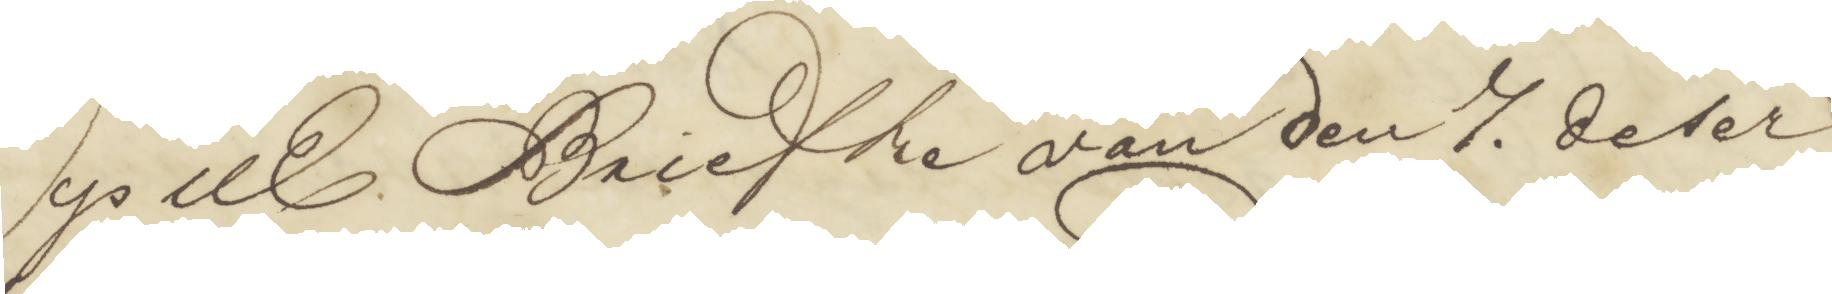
Op uE Briefke van den 7. deser
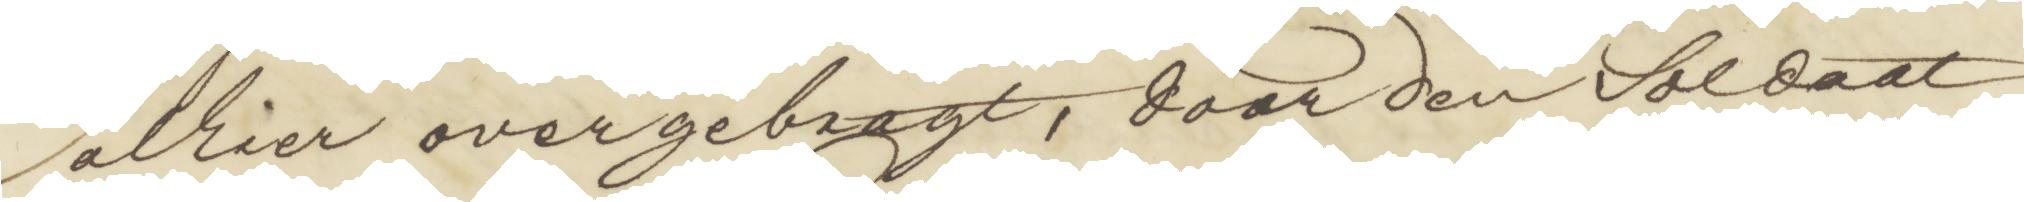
alhier overgebragt, door den soldaat
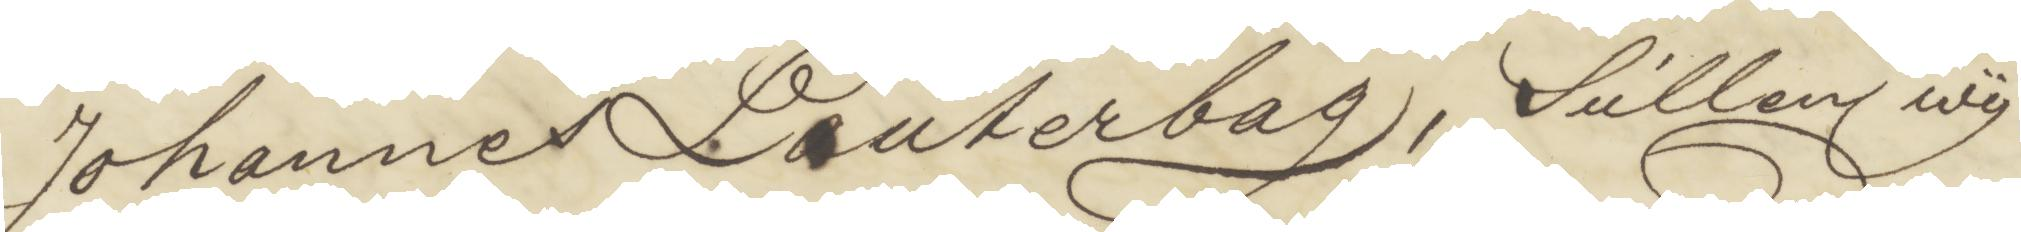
Johannes Lauterbag, sullen wij
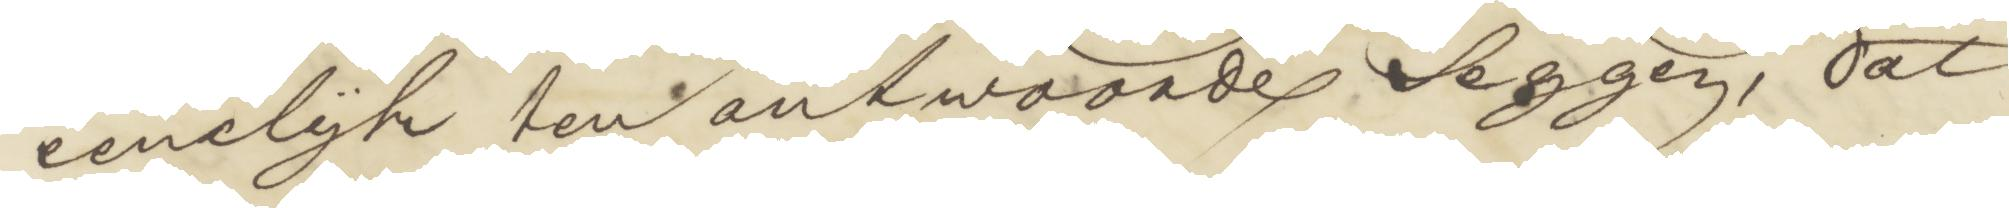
eenelijk ten antwoorde seggen, dat
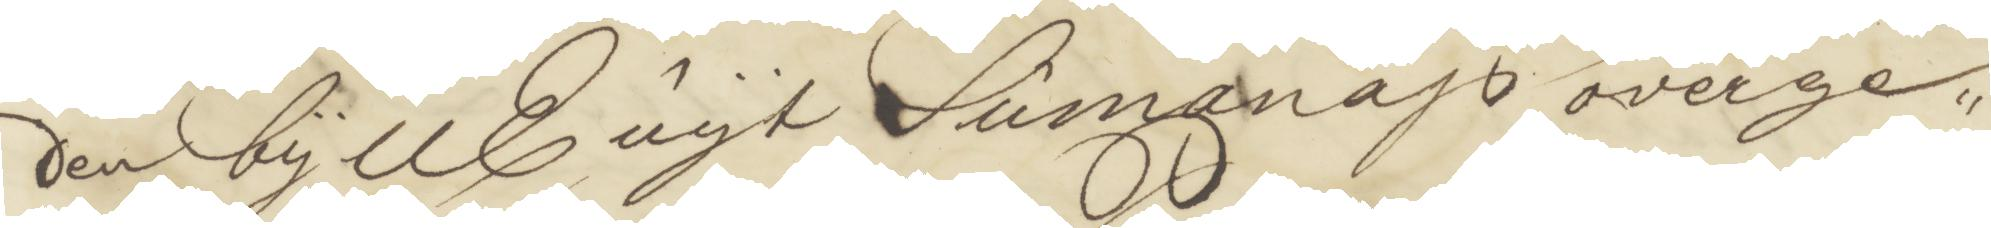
den bij uE uijt sumanap overge„
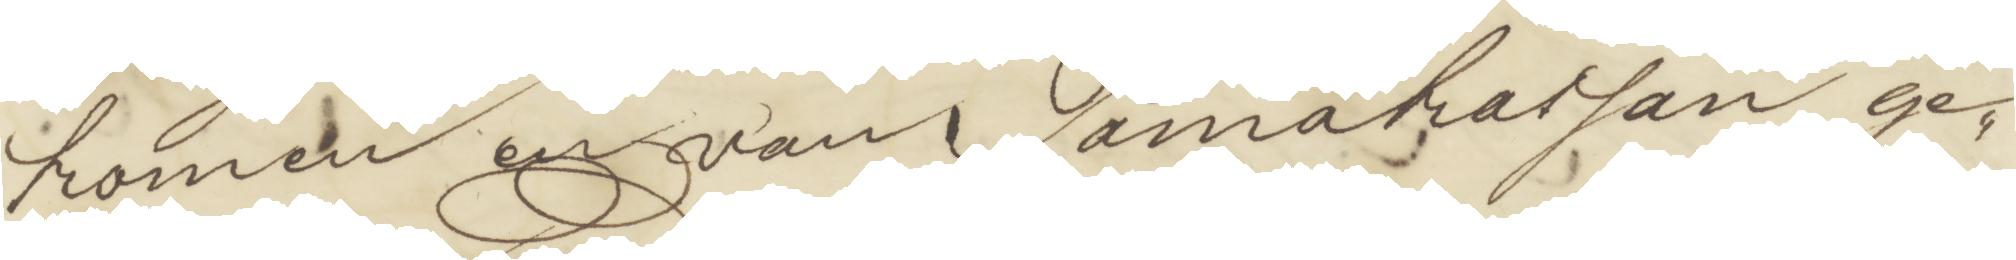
komen en van Pamakassan ge„
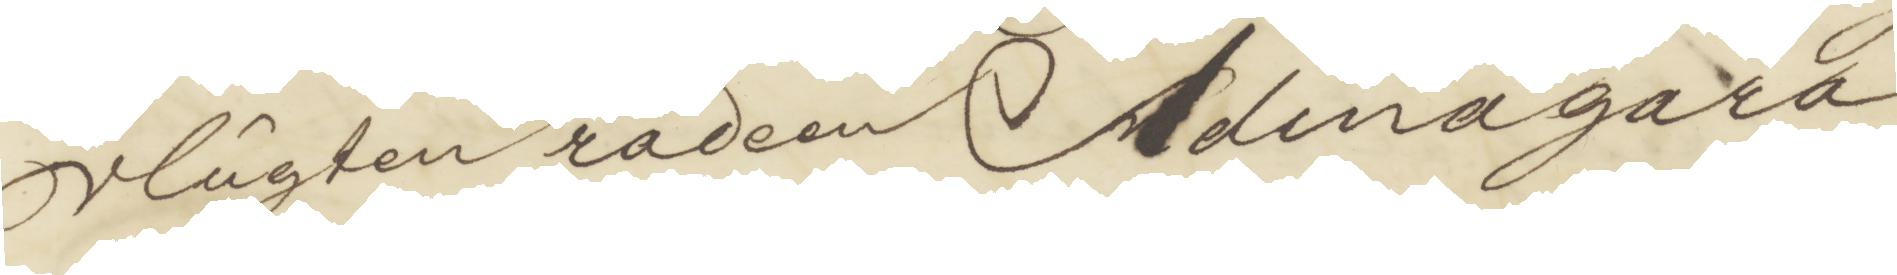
vlugten radeen Adinagara,
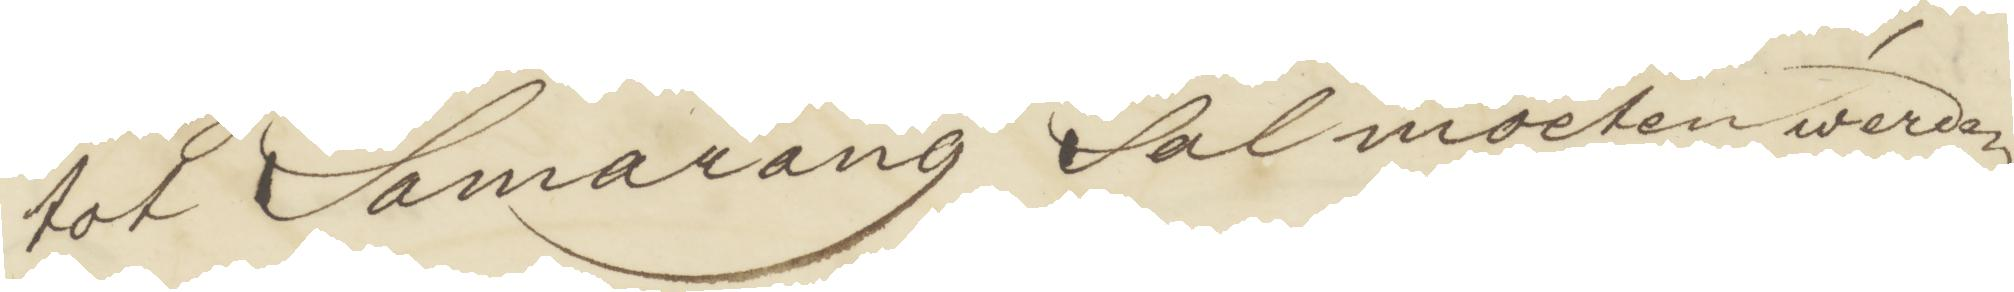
tot samarang sal moeten werden
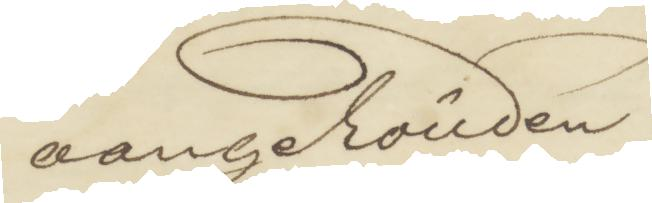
aangehouden
